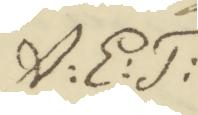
A:E:T:
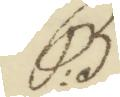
P:B
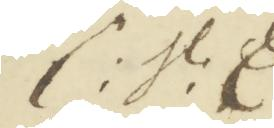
C:V:E:
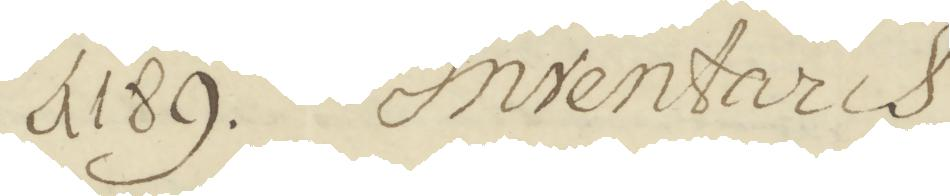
No 4189. Inventaris
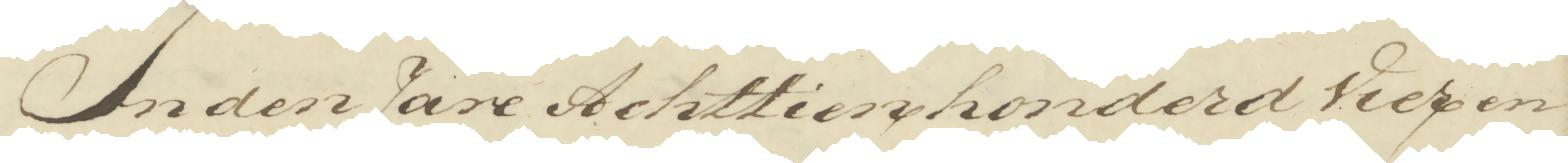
In den Jare Achttien honderd Vier en
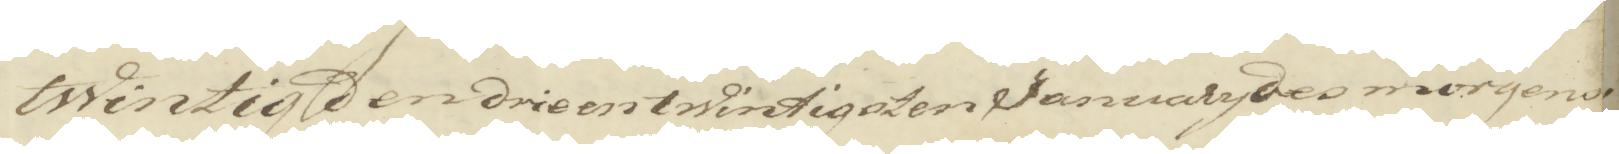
twintig den drie en twintigsten Ianuary des morgens
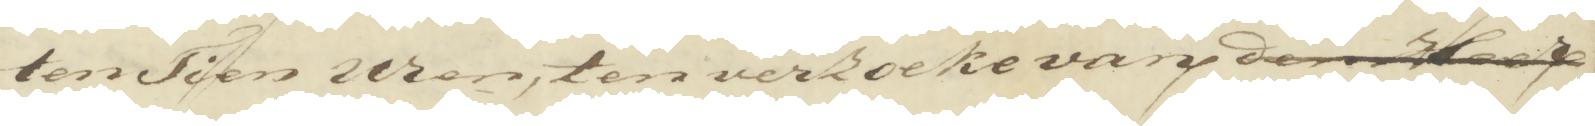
ten Tien uren, ten verzoeke van den Heer
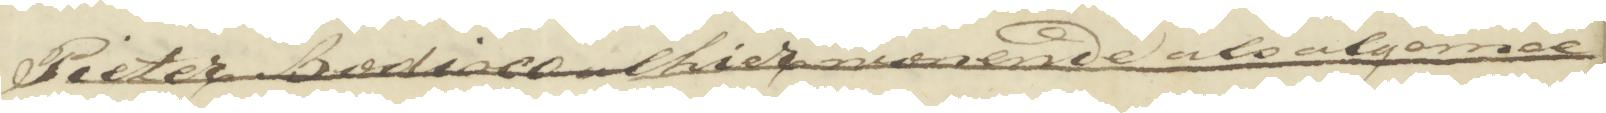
Pieter Bodisco alhier wonende als algemee
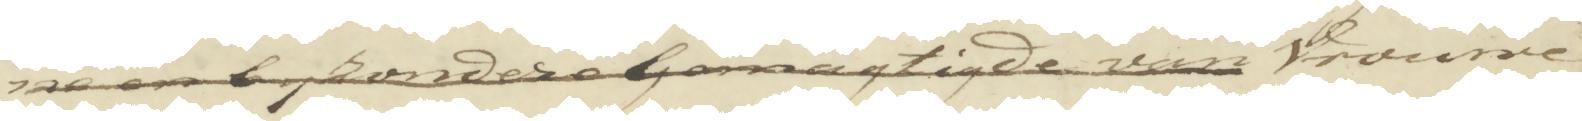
ne en byzondere Gemagtigde van Vrouwe
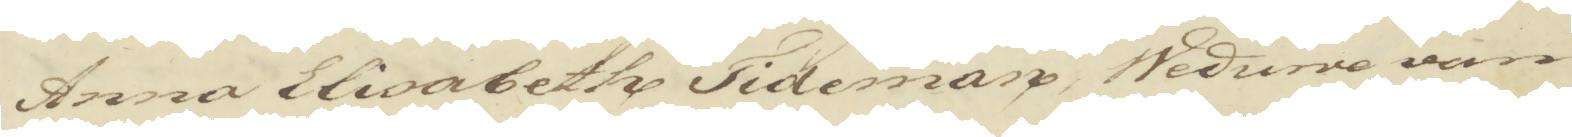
Anna Elisabeth Tideman, Weduwe van
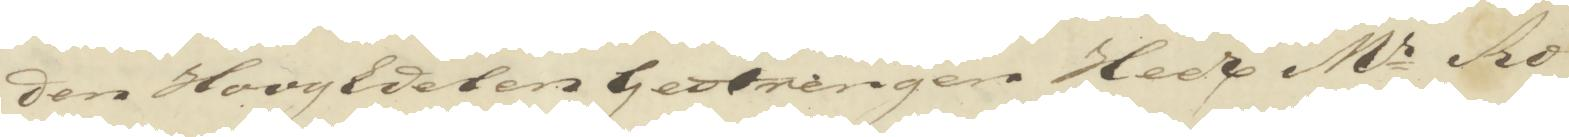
den HoogEdelen Gestrengen Heer M=r Ro
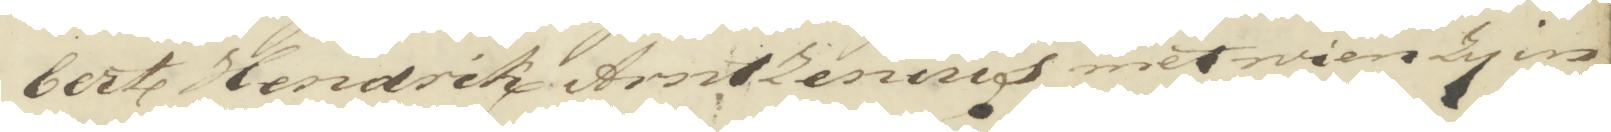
bert Hendrik Arntzenius met wien zy in
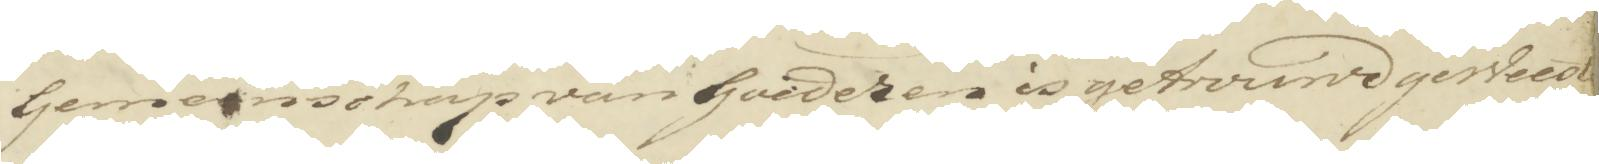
Gemeenschap van Goederen is getrouwd geweest
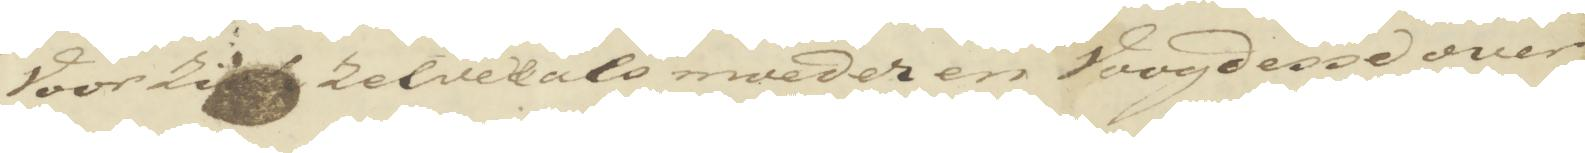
Voor zich zelve & als moeder en Voogdesse over
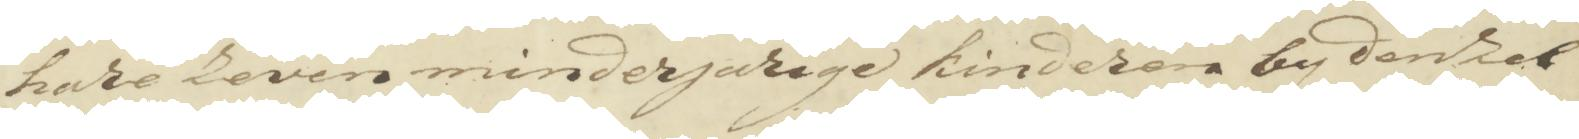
hare zeven minderjarige kinderen by denzel
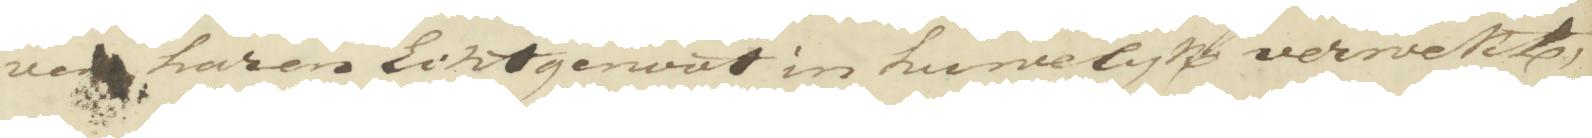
ven haren Echtgenoot in huwelyk verwekt,
